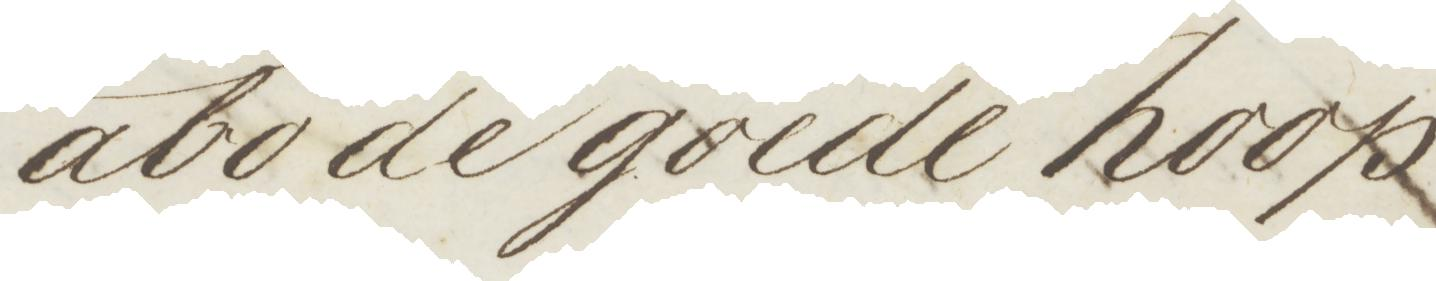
abo de goede hoop
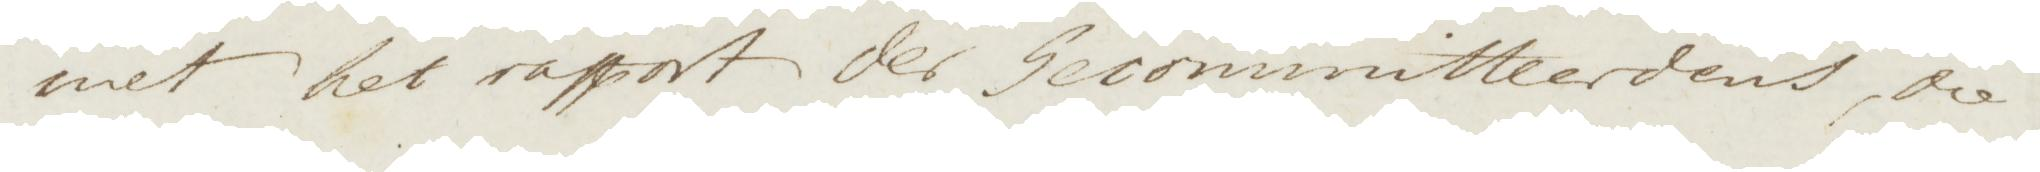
met het rapport der Gecommitteerdens , die
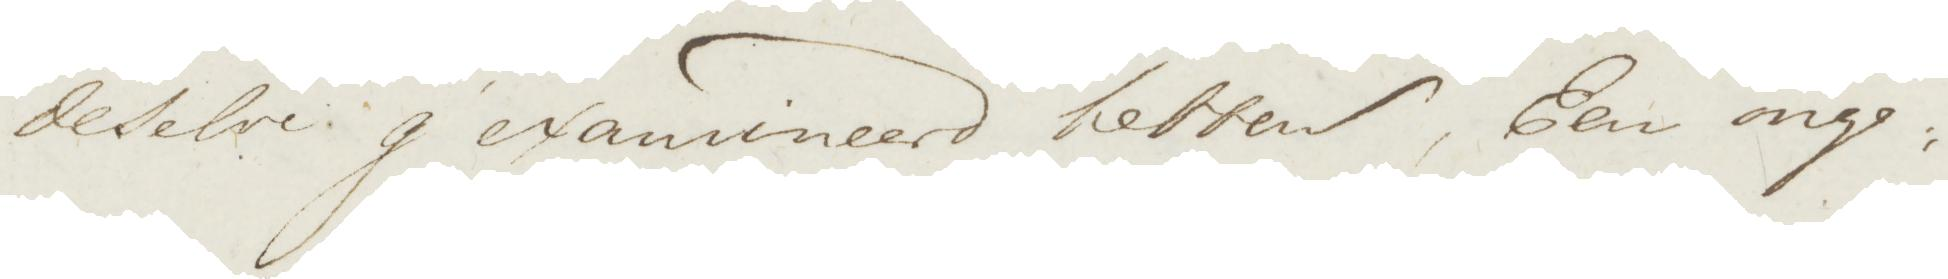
deselve g’examineerd hebben , Een onge„
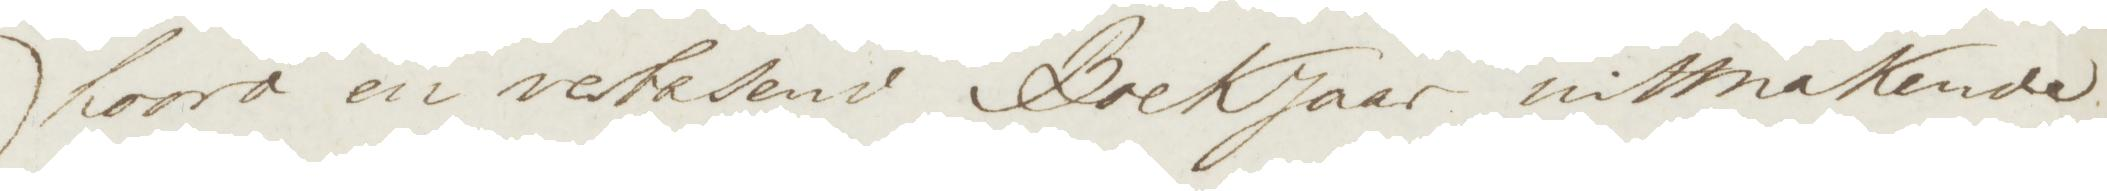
hoord en verbasend Boekjaar uitmakende
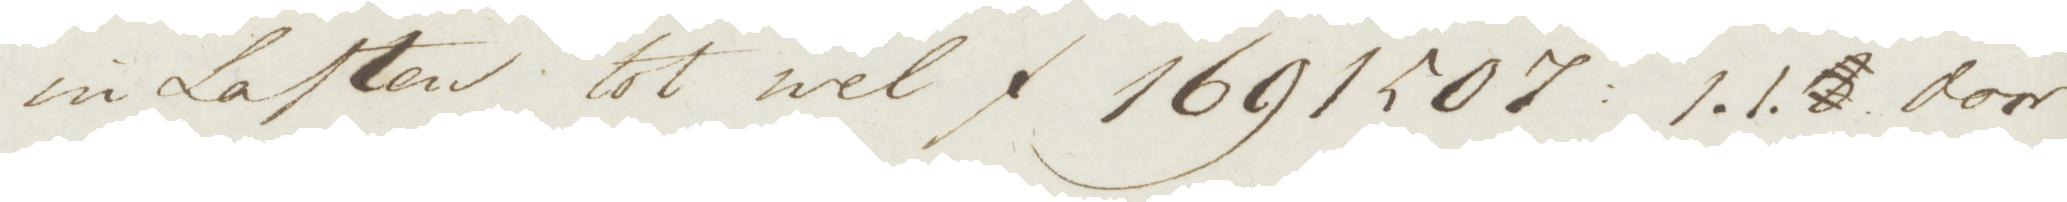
in Lasten tot wel ƒ 1691507: 1:1.8 door
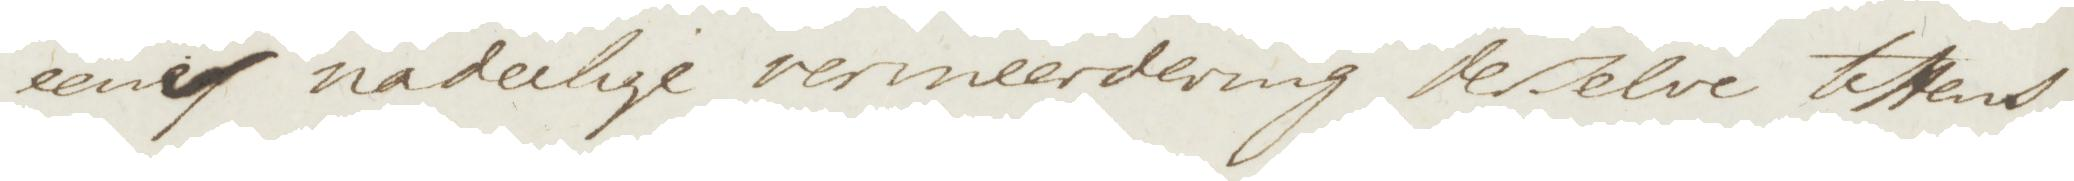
eene nadeelige vermeerdering deszelve teffens
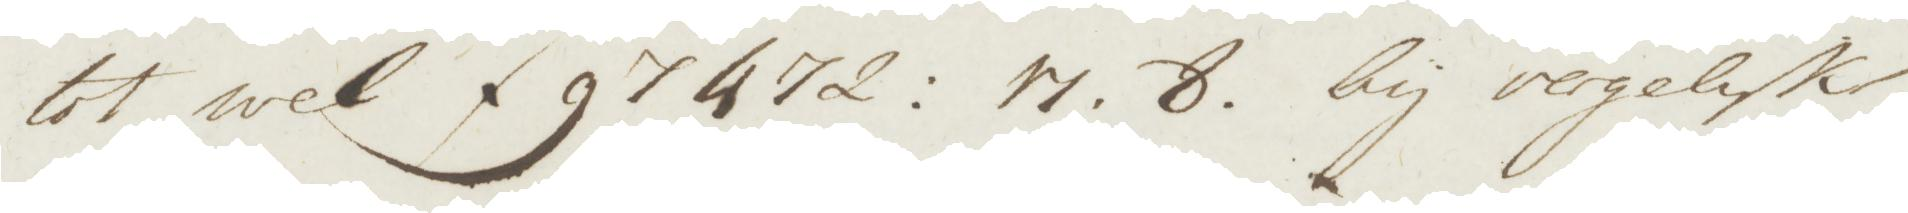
tot wel ƒ 97472: 17. 8. bij vergelyk
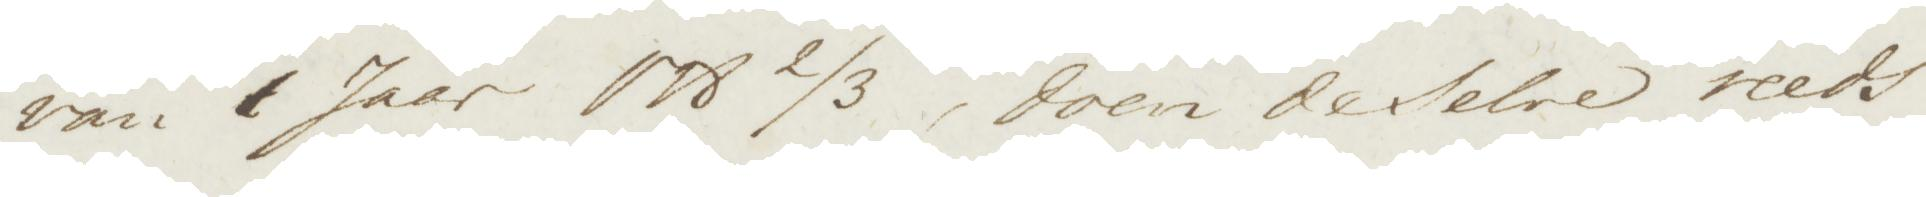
van t Jaar 178 2/3 , doen deselve reeds
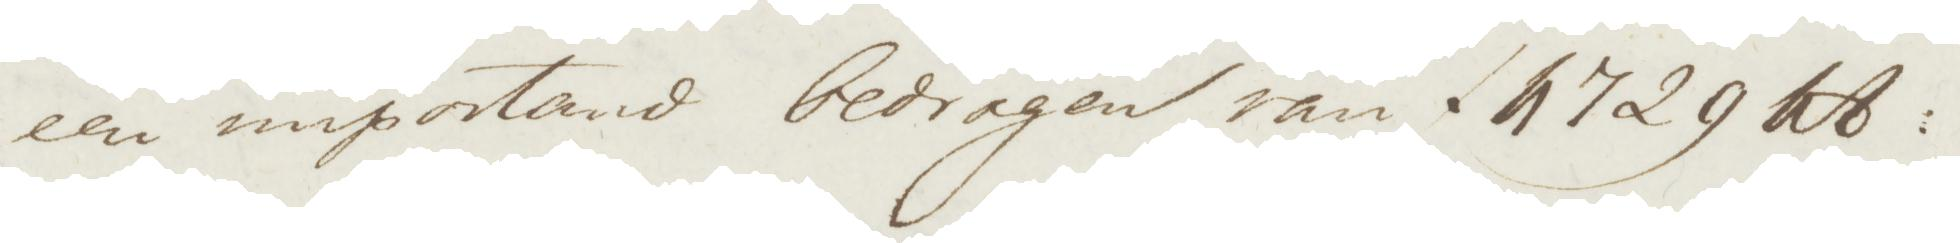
een importand bedragen van ƒ 472948 :
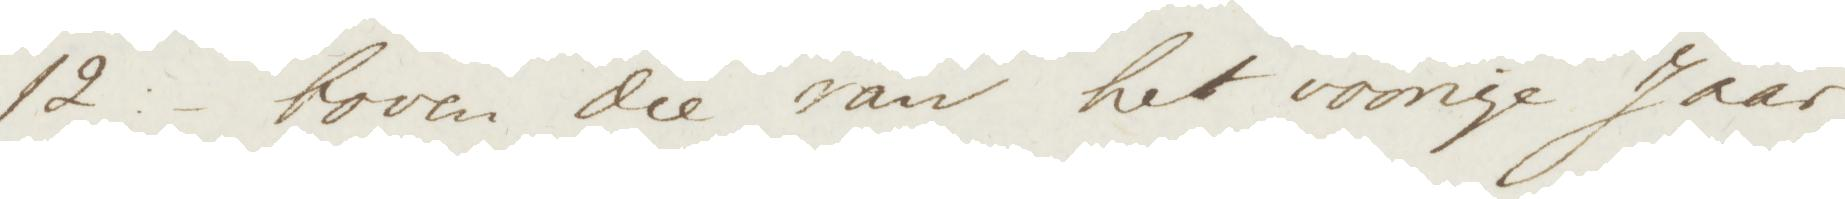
12: - boven die van het voorige Jaar
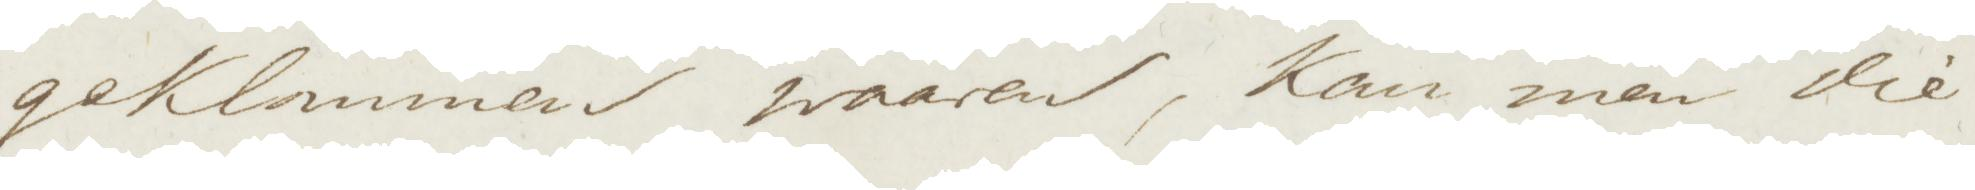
geklommen waaren, kan men die
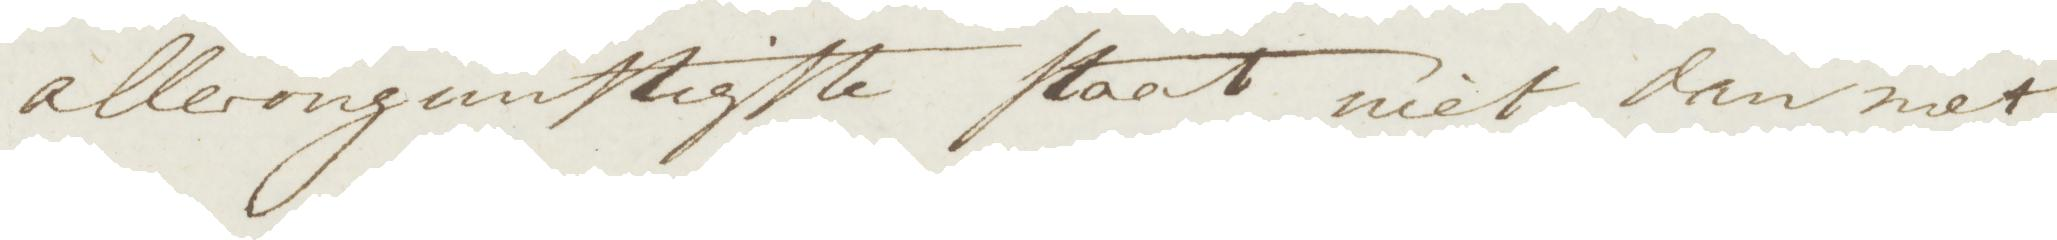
allerongunstigste staat niet dan met
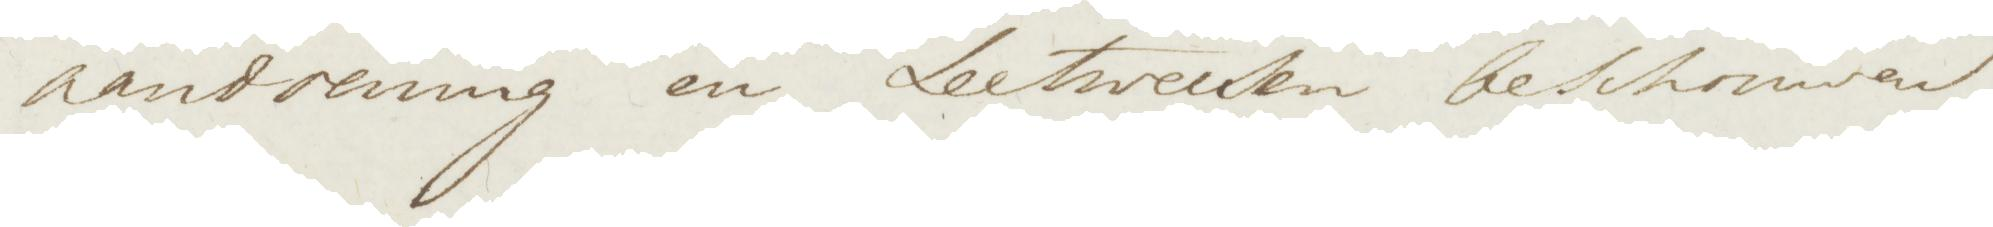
aandoening en Leetweesen beschouwen
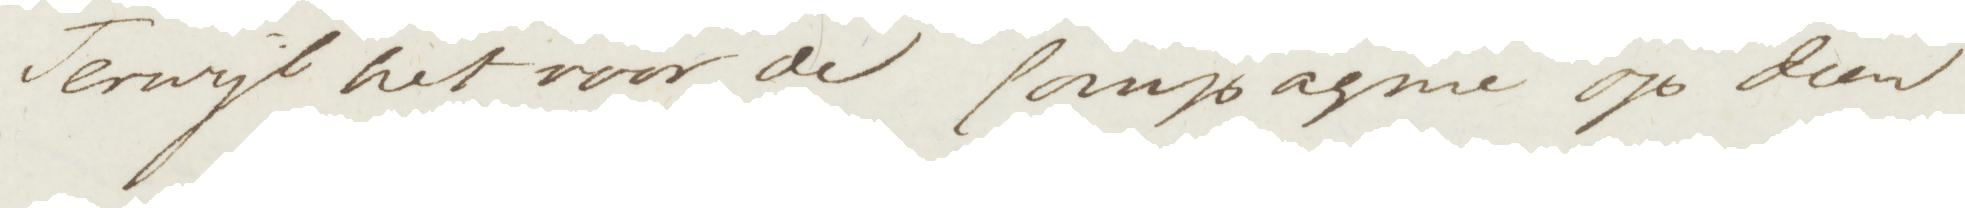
Terwijl het voor de Compagnie op dien
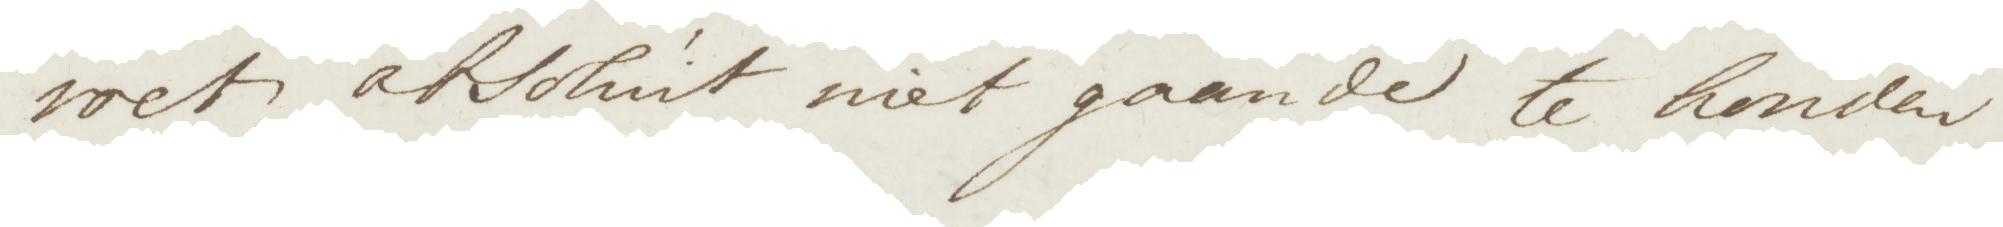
voet afschut niet gaande te honden
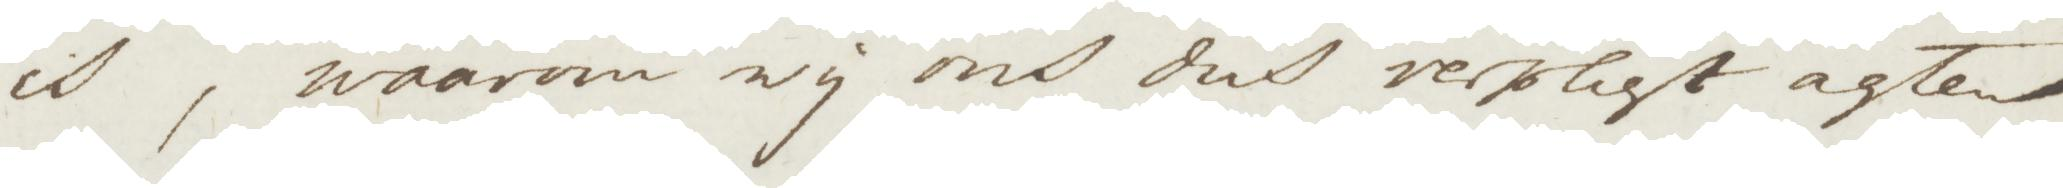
is , waarom wij ons dus verpligt agten
